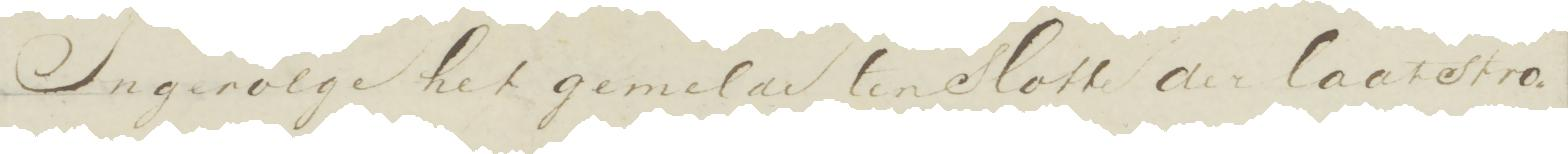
Jngevolge het gemelde ten slotte der laatstvo„
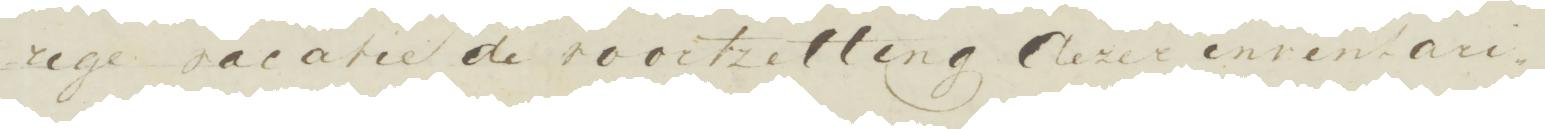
=rige vacatie de voortzetting dezer inventari„
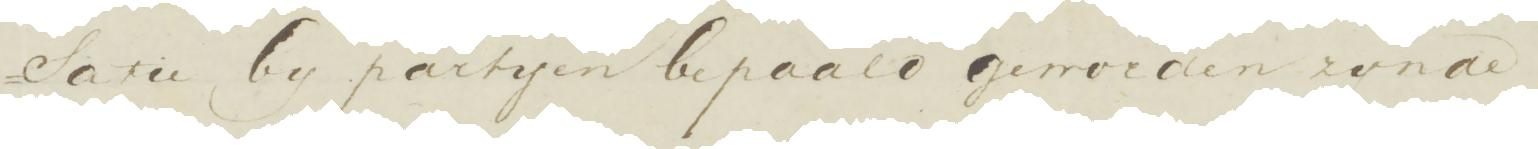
=satie by partyen bepaald geworden zynde
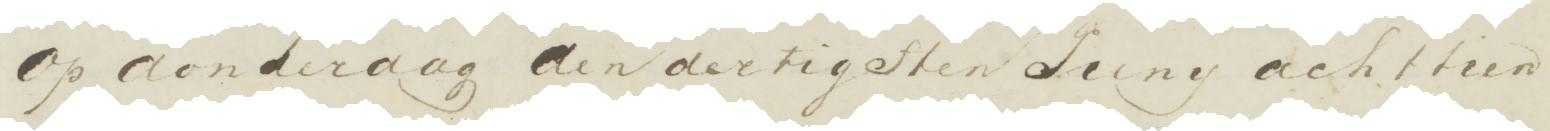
op donderdag den dertigsten Juny achttien
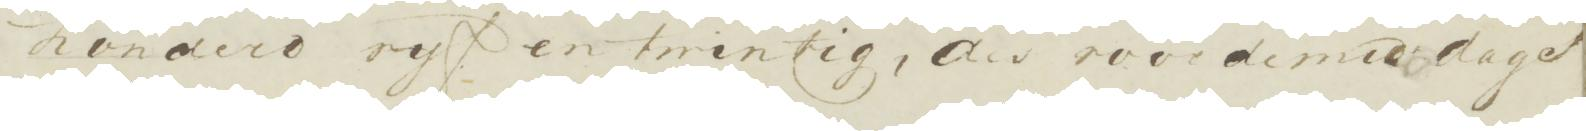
honderd vyf en twintig, des voor de middags
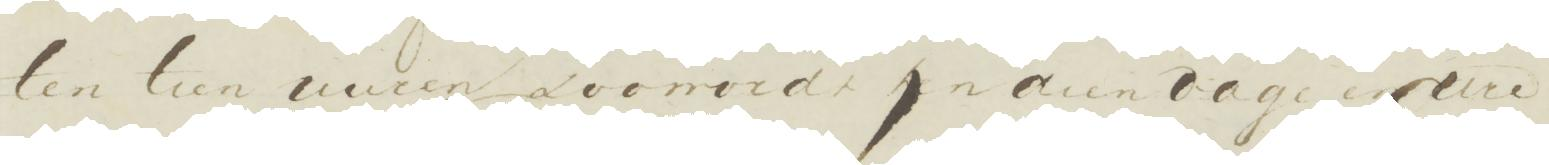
ten tien uuren zoo wordt ten dien dage en ure
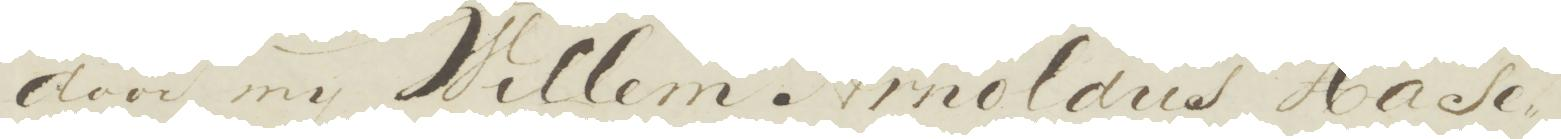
door my Willem Arnoldus Hase„
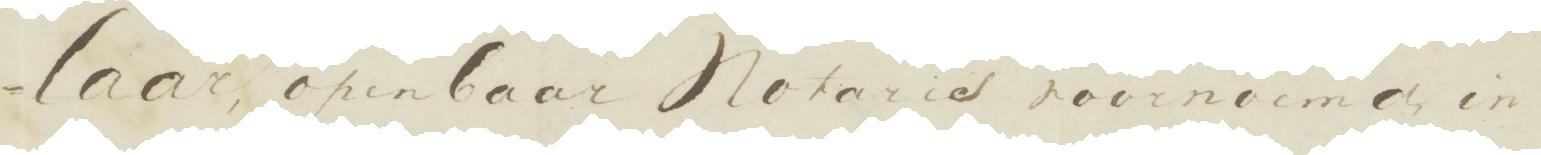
=laar, openbaar Notaris voornoemd, in
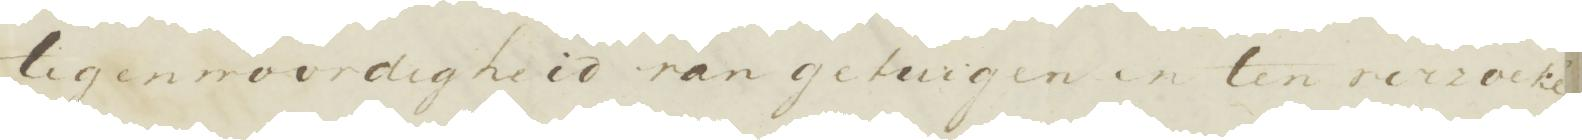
tegenwoordigheid van getuigen en ten verzoeke
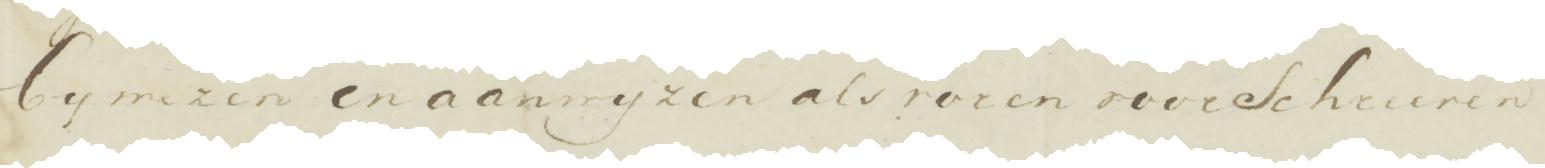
by wezen en aan wyzen als voren voorschreeven
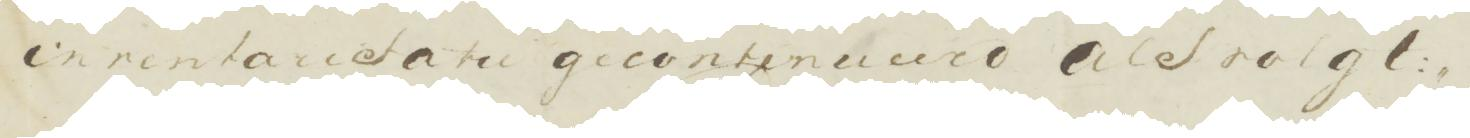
inventarisatie gecontinueerd als volgt:„
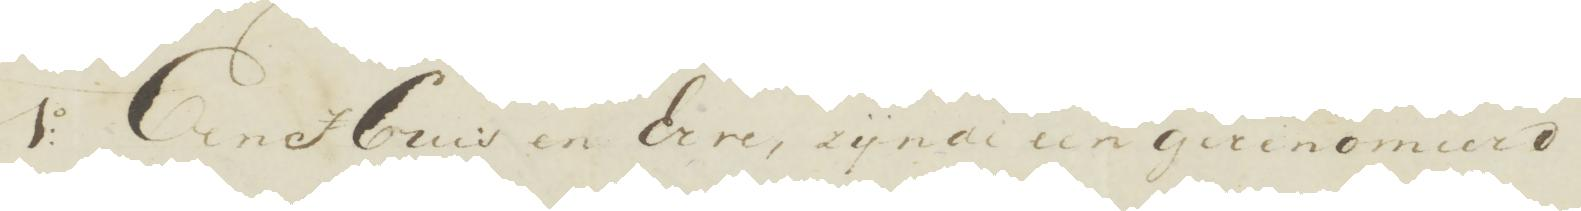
1:o Een Huis en Erve, zijnde een gerenomeerd
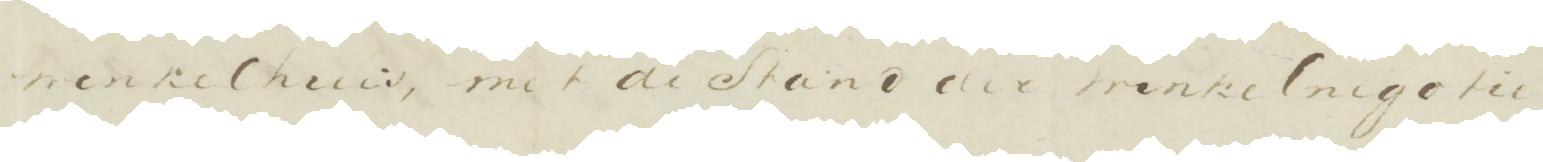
winkelhuis, met de stand der winkelnegotie
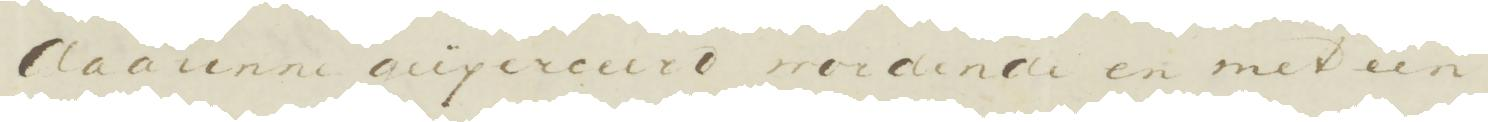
daarinne geëxerceerd wordende en met een
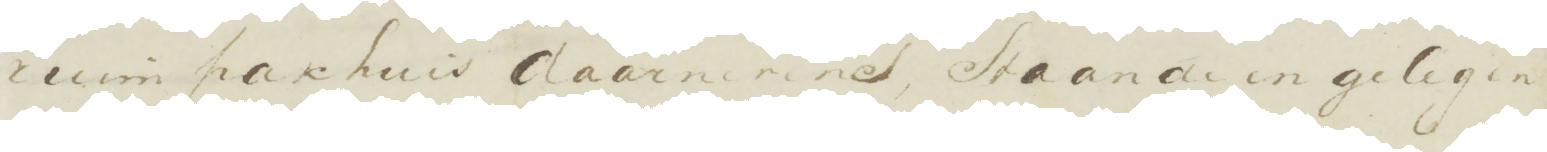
ruim pakhuis daarnevens, staande en gelegen
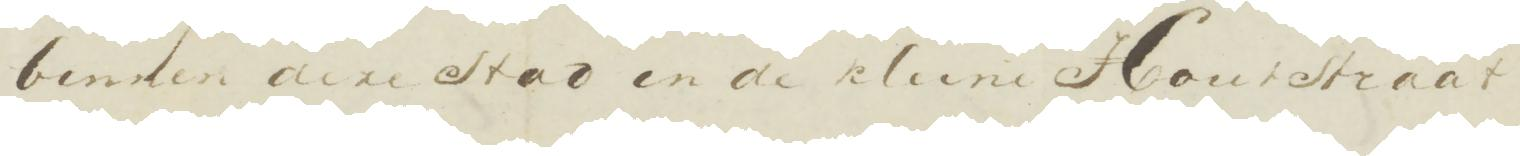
binnen deze Stad in de kleine Houtstraat
